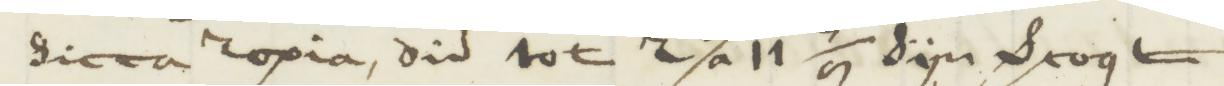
sicca ropia, die tot ro/a 11 7/8 sijn vercogt
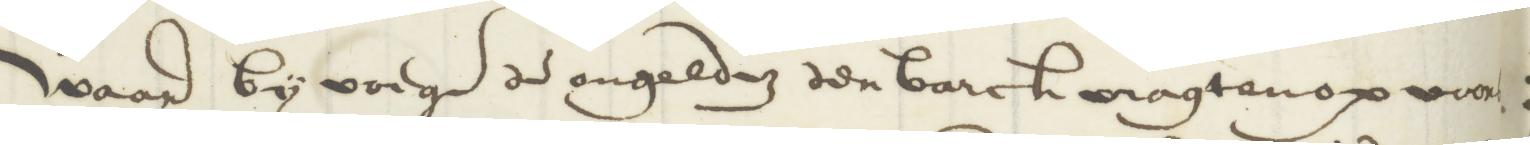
waar bij voege de ongelden der barck vragtenop voor
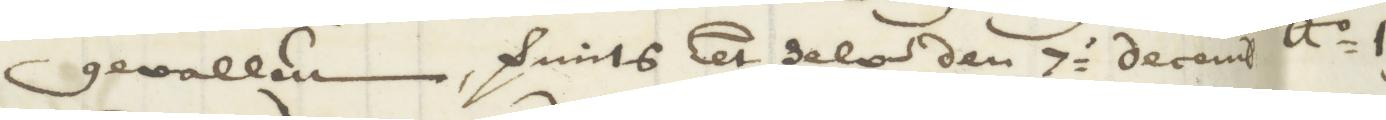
gevallen, vermits het selve den 7:' decem
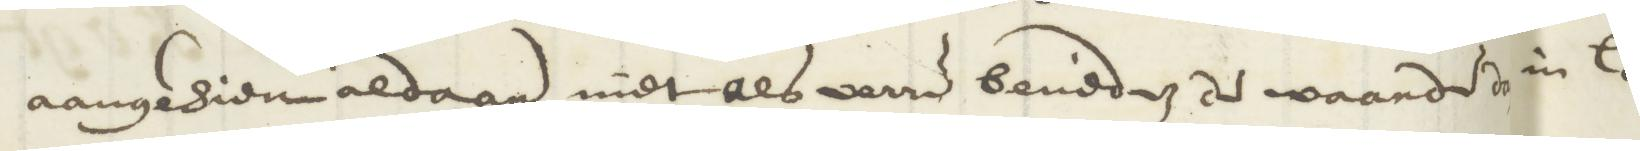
aangesien aldaar niet als verre beneden de waarde d
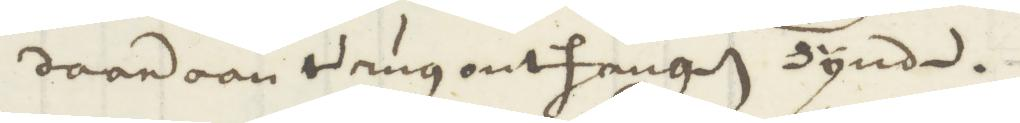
daar aan terug ontfangen sijnde.
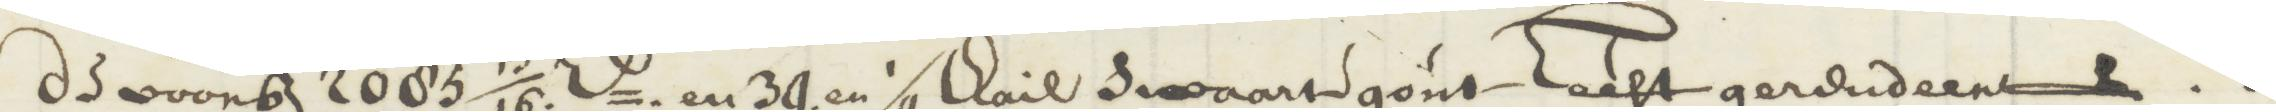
de voors 2085 13/16. R=o. en 34. en ¼ thail swaarte gout heeft gerendeert..
